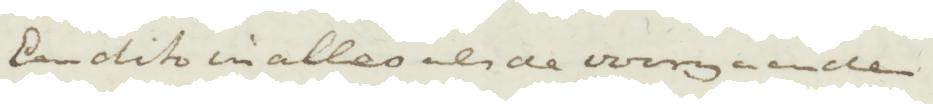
Een dito in alles als de voorgaande
